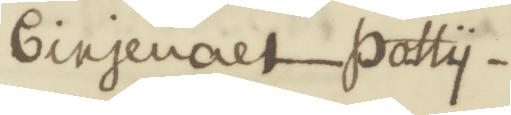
birjenaet pattij
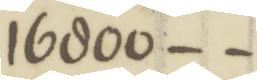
16800 – –
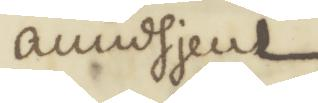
annesjent
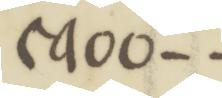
5400 –
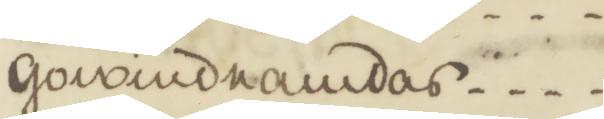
gowindramdas - - -
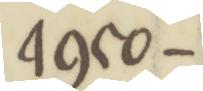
4950 –
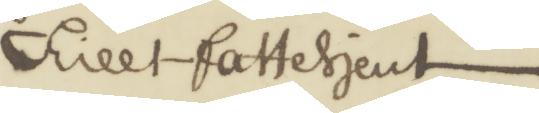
chieet fattesjent
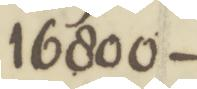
16800 –
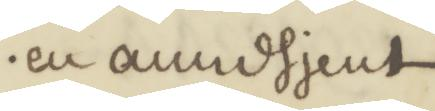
en annesjent
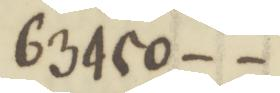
63450 – –
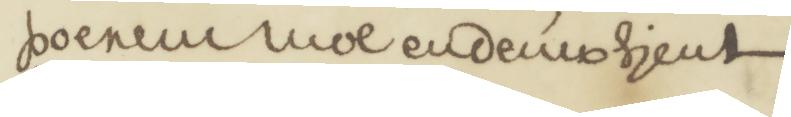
poerem mol endeuwsjent
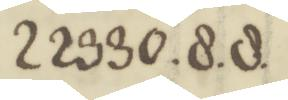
22330.8.8.
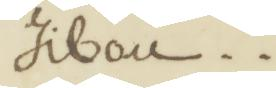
Iibon -
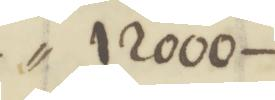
„ 12000 —
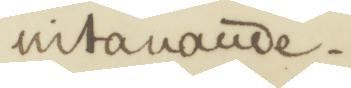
nitanande -
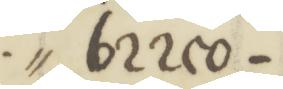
„ 62250 –
